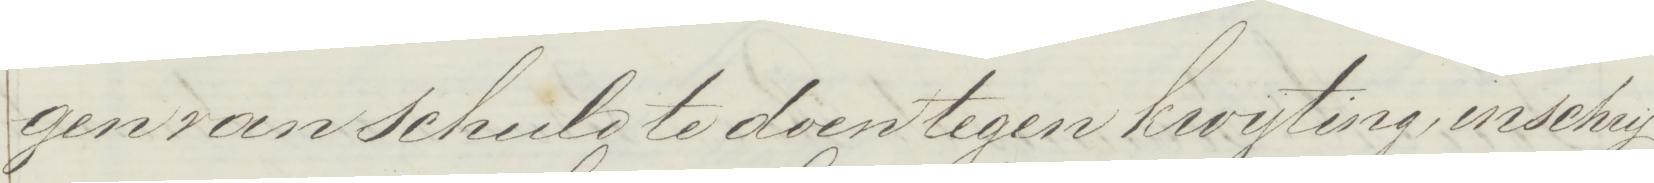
gen van Schuld te doen tegen kwijting, inschrij
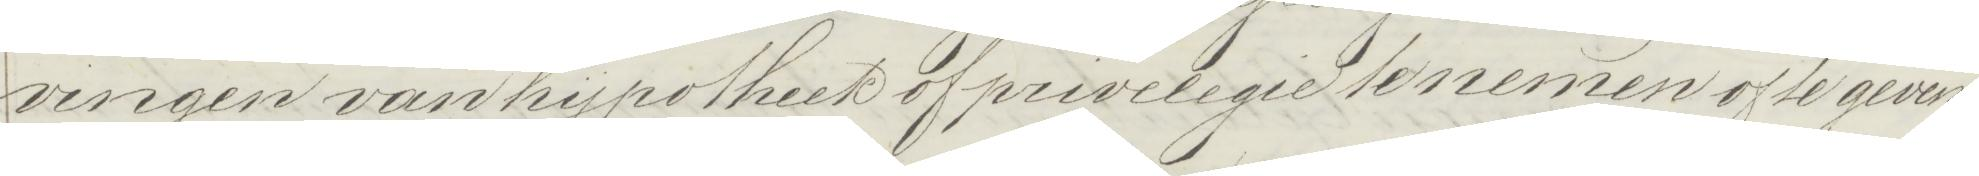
vingen van hijpotheek of privelegie te nemen of te geven
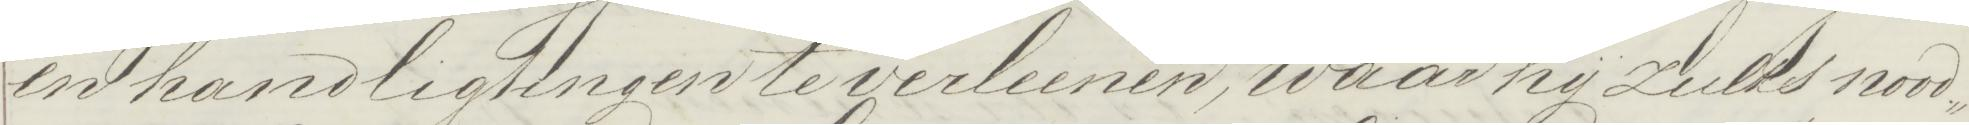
en handligtingen te verleenen, waar hij zulks nood„
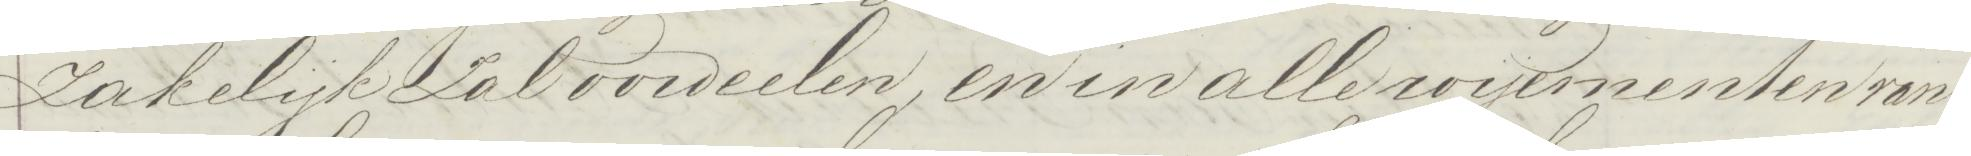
zakelijk Zal oordeelen, en in alle roijementen van
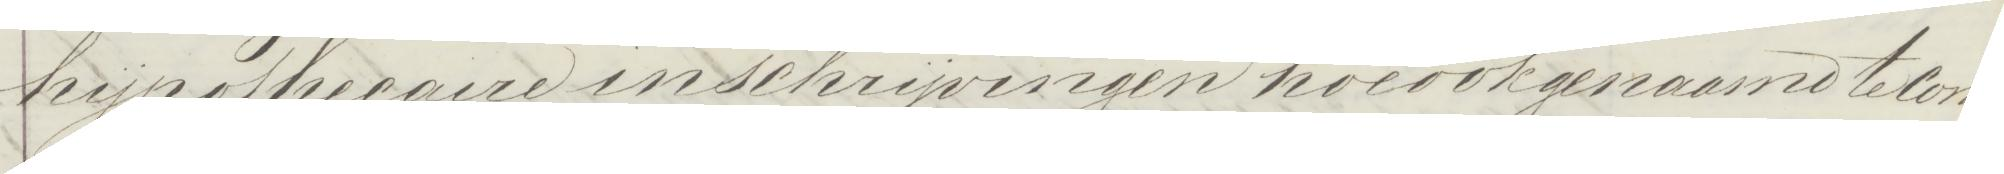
hijpothecaire inschrijvingen hoe ook genaamd te con
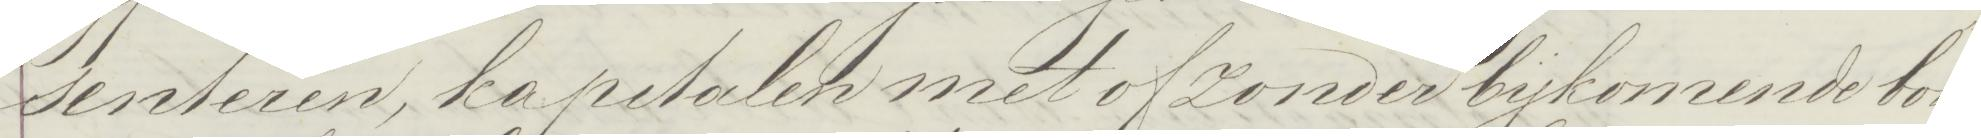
senteren, kapitalen met of zonder bijkomende bor
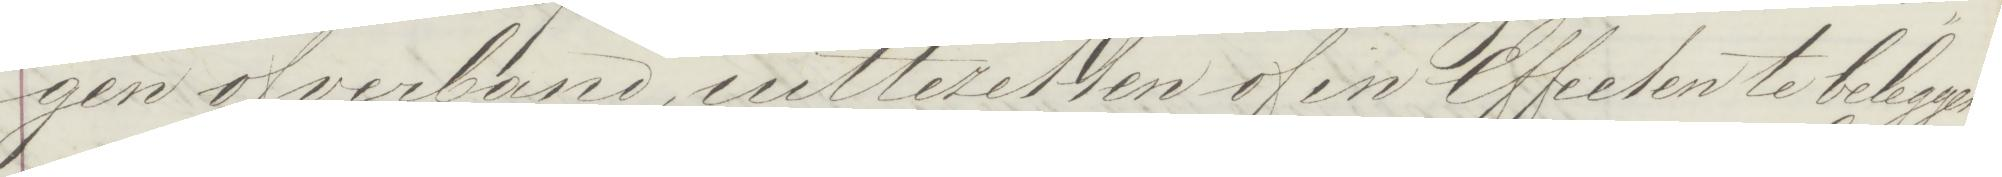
gen of verband, uit te zetten of in Effecten te beleggen
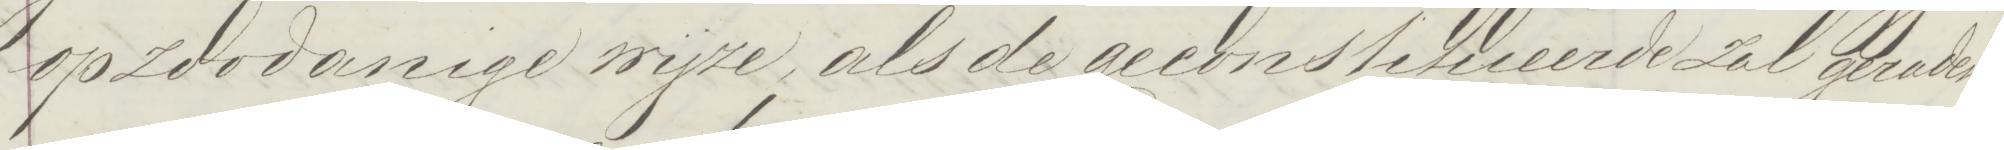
op zoodanige wijze, als de geconstitueerde zal geraden
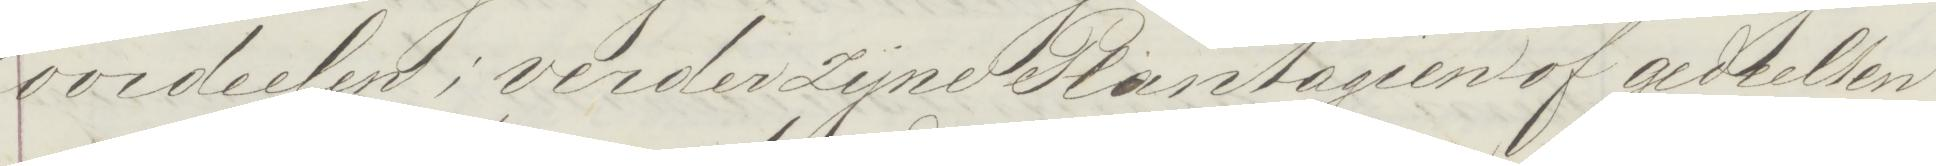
oordeelen; verder zijne Plantagien of gedeelten
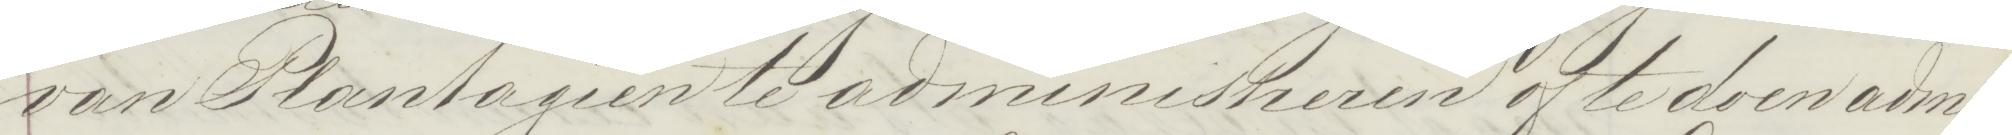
van Plantagien te administreren of te doen admi
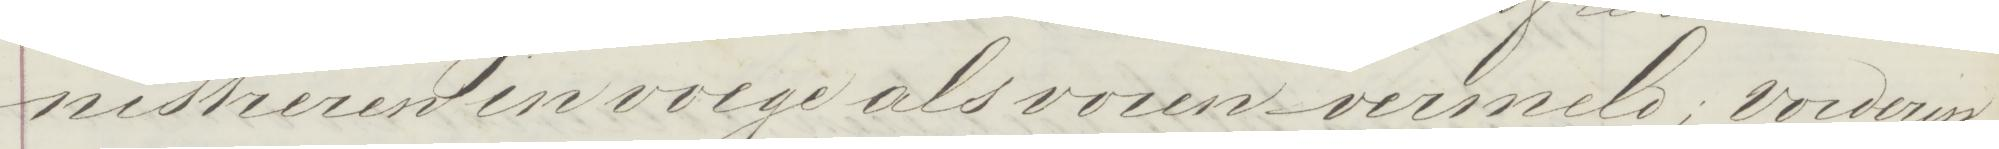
nistreren en volge als voren vermeld vorderin
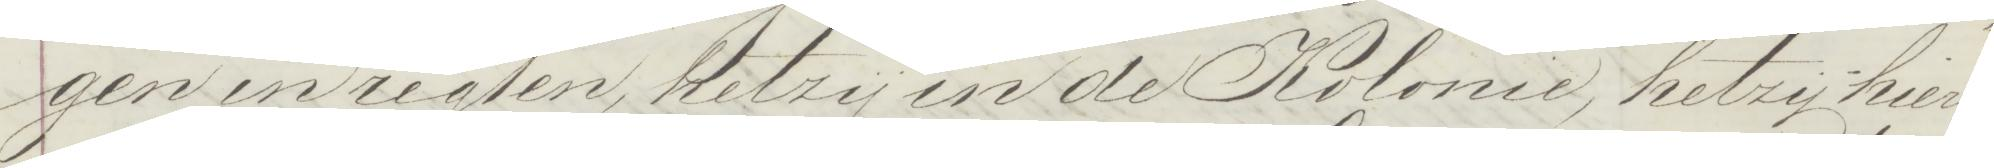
gen in regten, hetzij in de Kolonie, hetzij hier
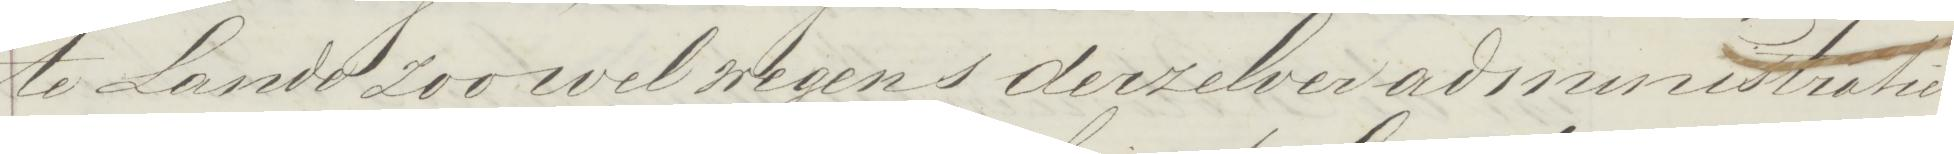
te Lande zoo wel wegens derzelver administratie
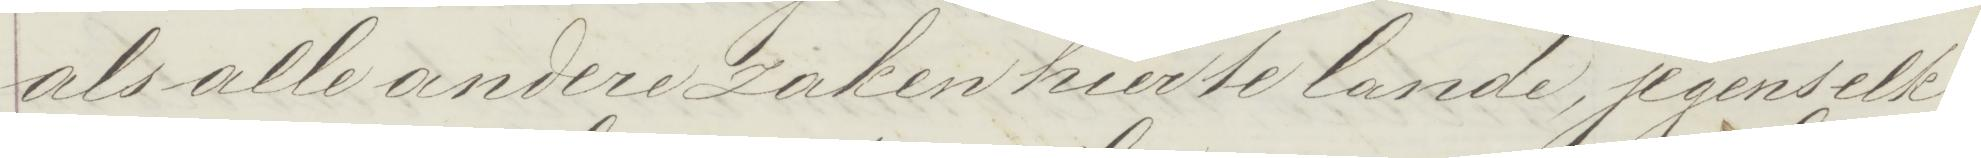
als alle andere zaken hier te lande, jegens elk
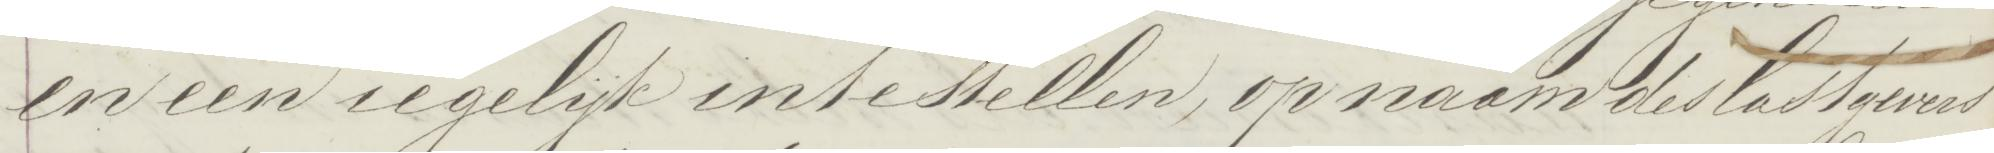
en een iegelijk in te stellen, op naam des lastgevers
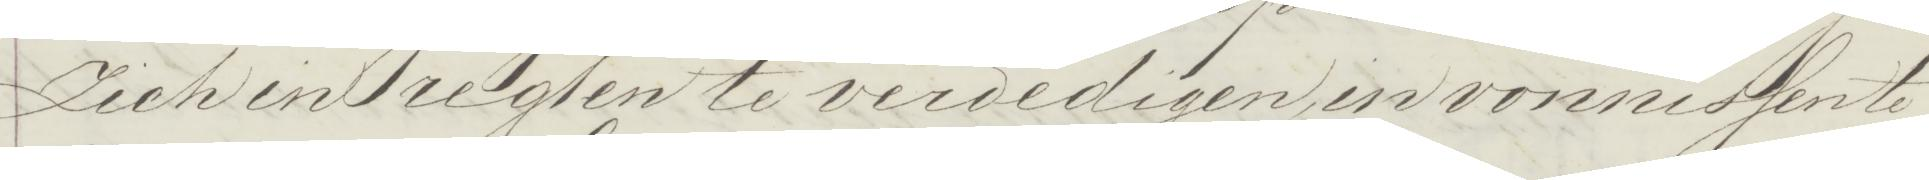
Zich in regten te verdedigen, in vonnissen te
